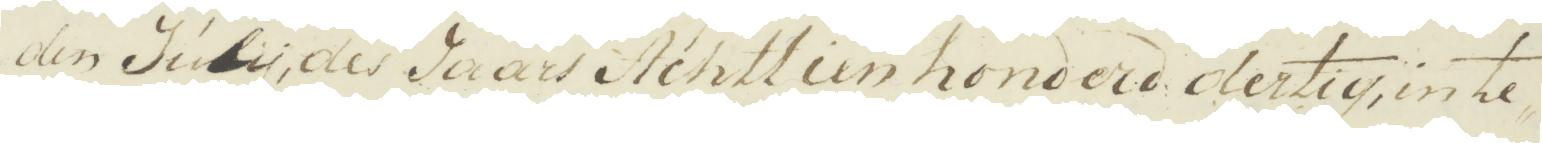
den Iulij, des Iaars Achttien honderd dertig, in te
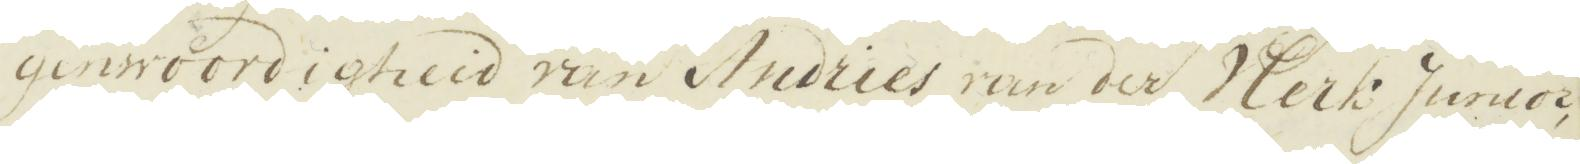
genwoordigheid van Andries van der Vlerk Junior,
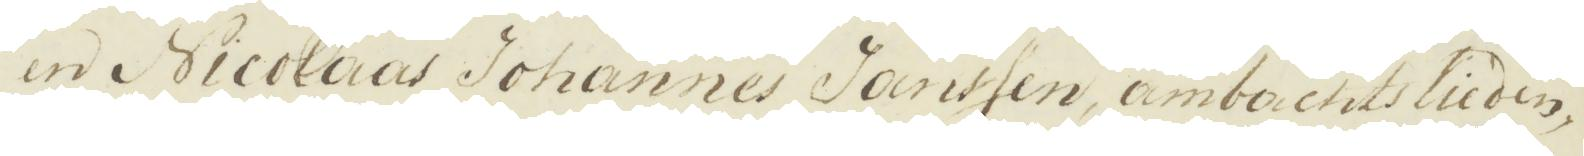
en Nicolaas Johannes Janssen, ambachtslieden,
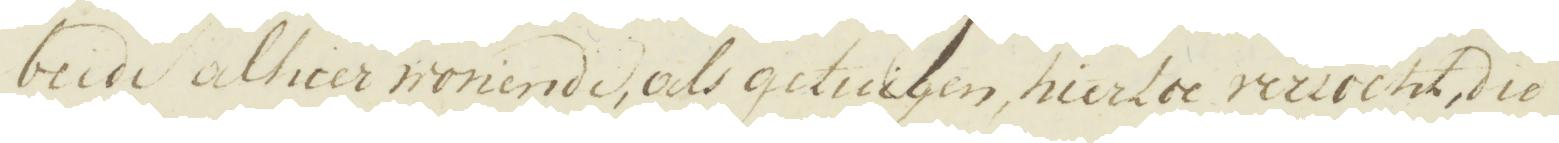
beide alhier wonende, als getuigen, hiertoe verzocht, die
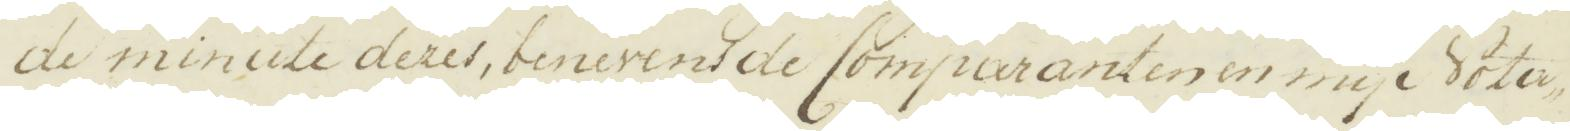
de minute dezes, benevens de Comparanten en mij Nota,
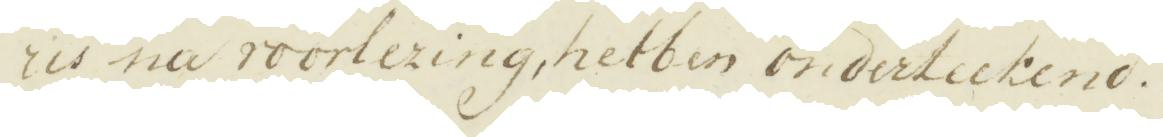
ris na voorlezing, hebben onderteekend.
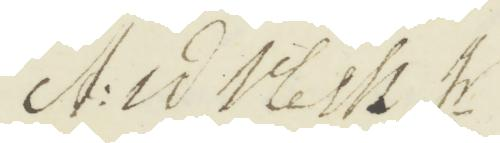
A: vd Vlerk J:r
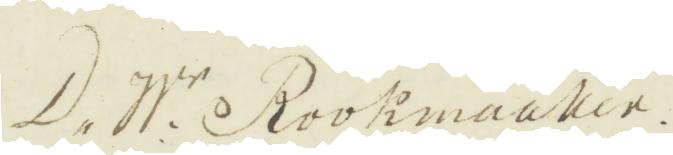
D„ W:r Rookmaaker
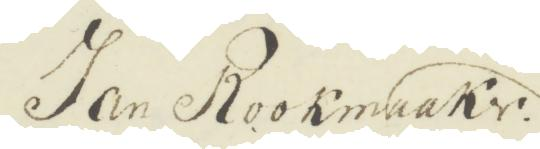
Ian Rookmaaker.
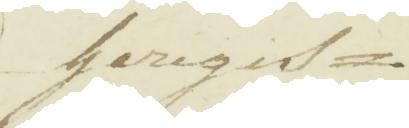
Geregis=
